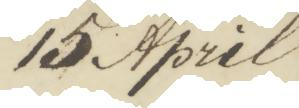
15 April
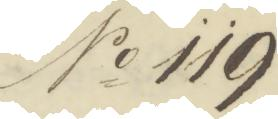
N=o 119
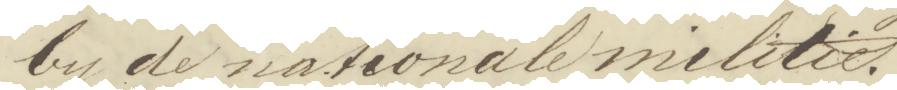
by de nationale militie.
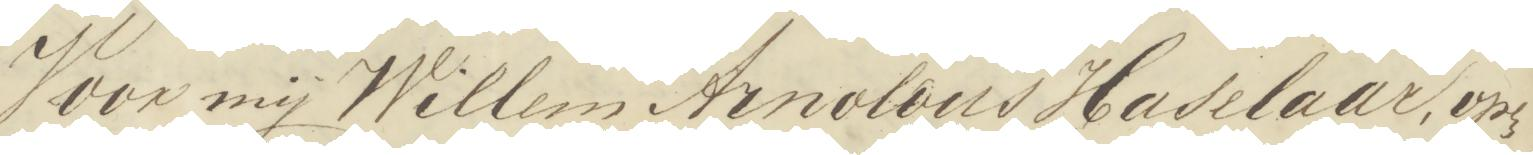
Voor mij Willem Arnoldus Haselaar, open
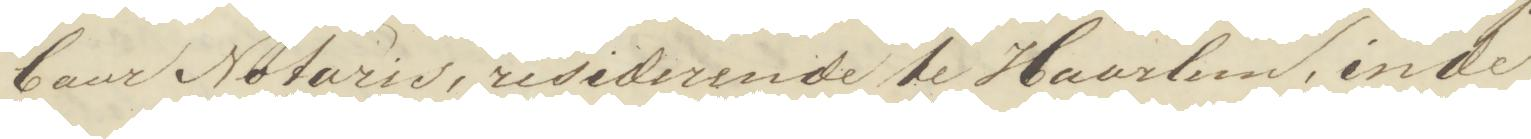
baar Notaris, residerende te Haarlem, in de
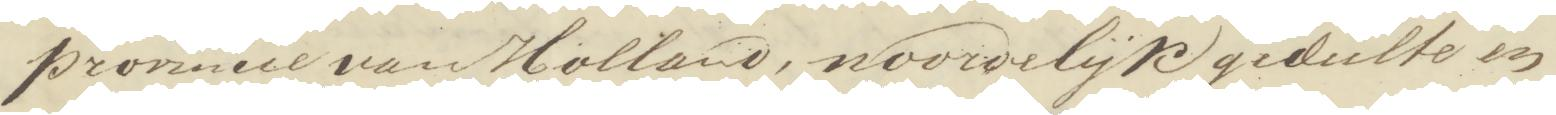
provincie van Holland, noordelijk gedeelte en
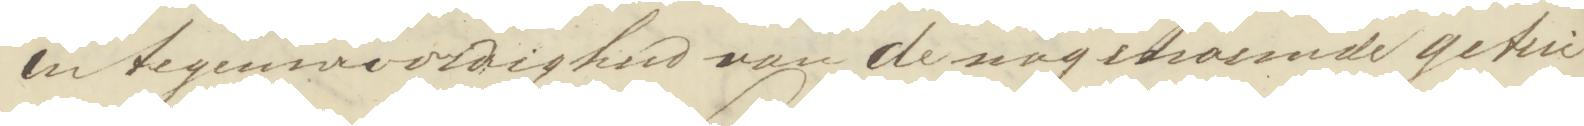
in tegenwoordigheid van de nagenoemde getui
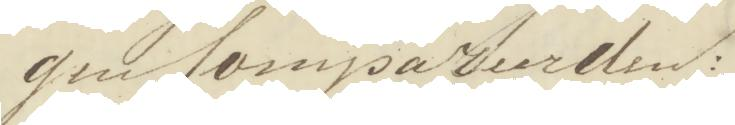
gen Compareerden:
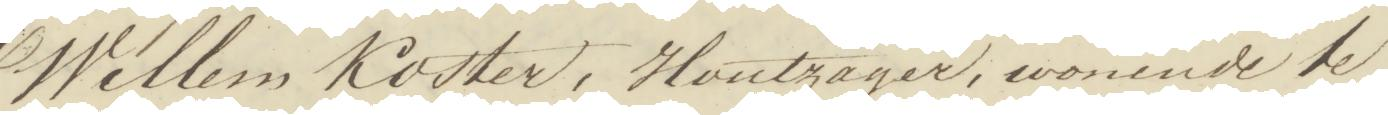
Willem Koster, Houtzager, wonende te
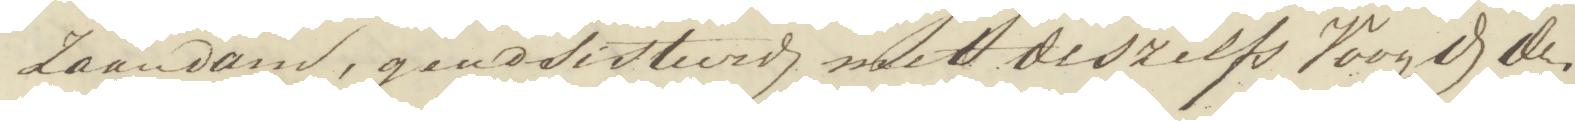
Zaandam, geadsisteerd, met deszelfs Voogd den
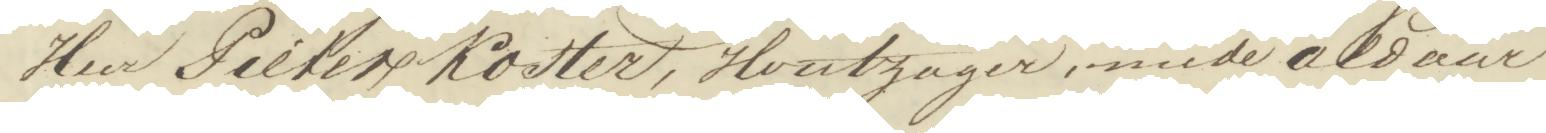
Heer Pieter Koster, Houtzager, mede aldaar
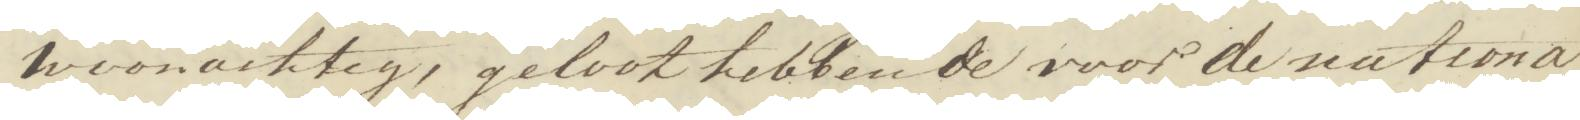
woonachtig, geloot hebbende voor de nationa,
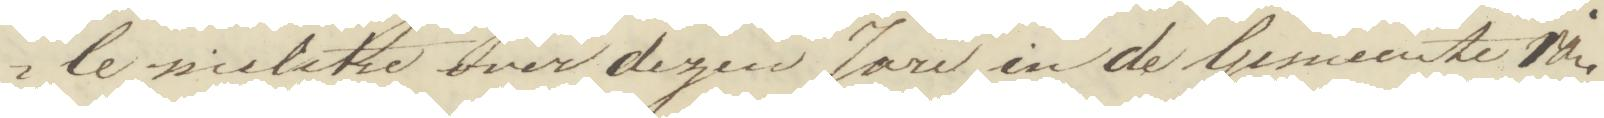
„ le militie over dezen Jare in de Gemeente van
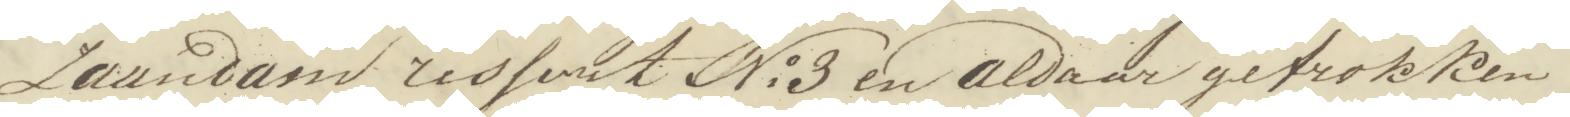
Zaandam ressort N:o 3 en aldaar getrokken
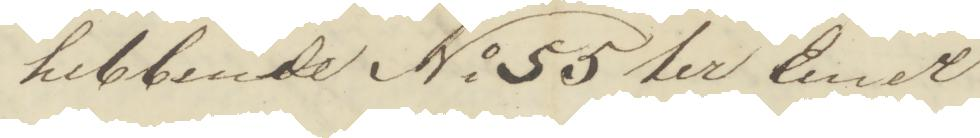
hebbende N:o 55 ter Eener
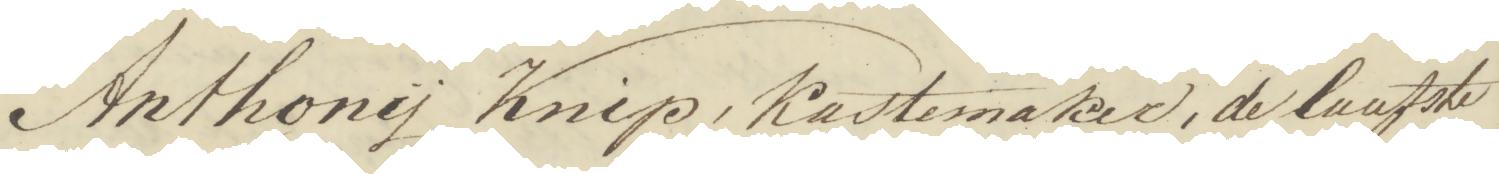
Anthonij Knip, Kastemaker, de laatste
